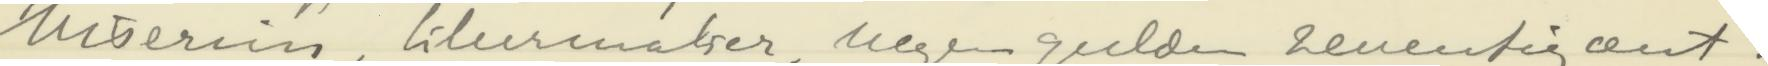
Muserin, kleermaker, negen gulden zeventig cent
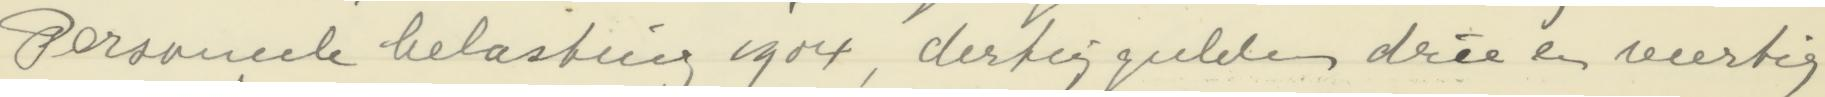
Personeele belasting 1904, dertig gulden drie en veertig
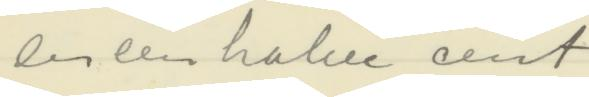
een een halve cent
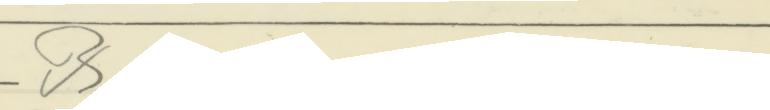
Begrafeniskosten
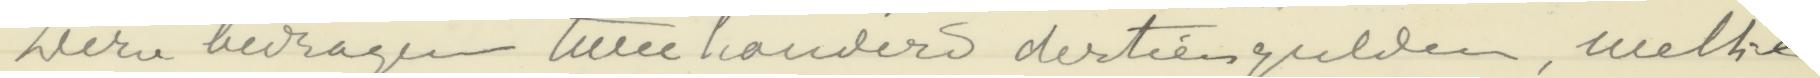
Deze bedragen twee honderd dertien gulden, welke
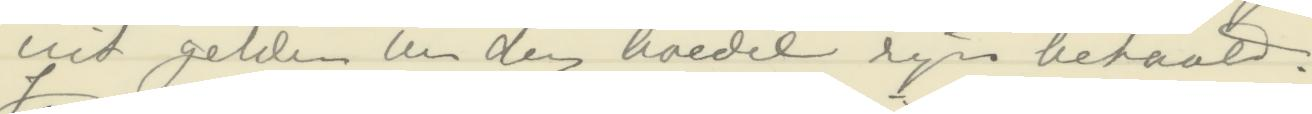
uit gelden van den boedel zijn betaald.
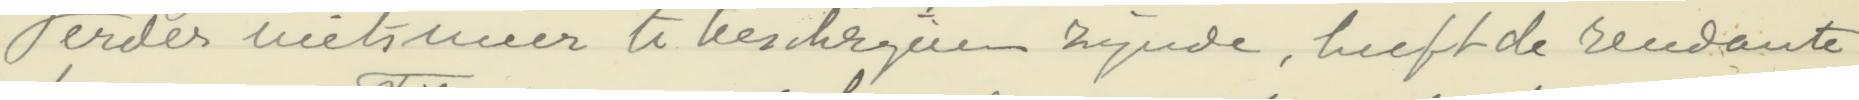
Verder niets meer te beschrijven zynde, heeft de rendante
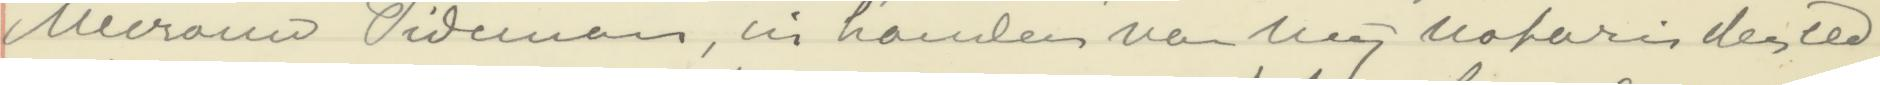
Mevrouw Tideman, in handen van mij notaris den eed
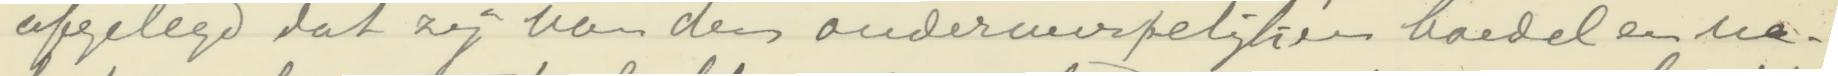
afgelegd dat zij van den onderworpelijken boedel en na-
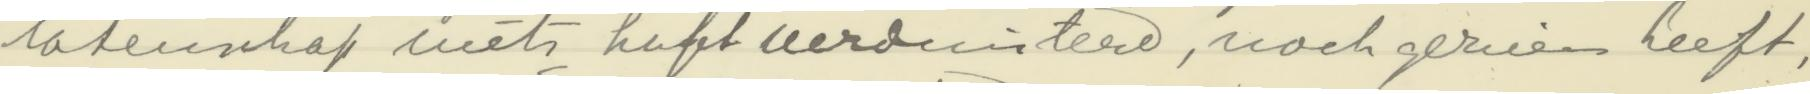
latenschap niets heeft verduisterd, noch gezien heeft,
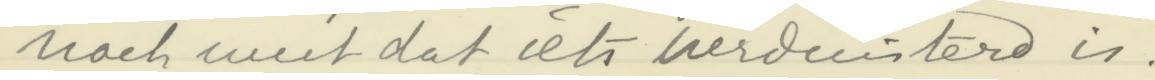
noch weet dat iets verduisterd is.
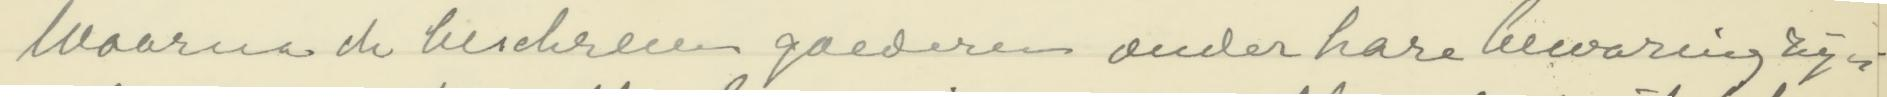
Waarin de beschreven goederen onder hare bewaring zijn
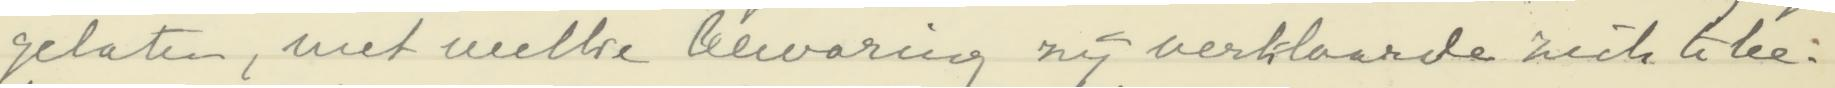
gelaten, met welke bewaring zij verklaarde zich te be:
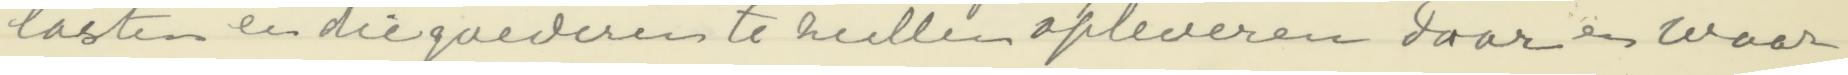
lasten en die goederen te zullen opleveren daar en waar
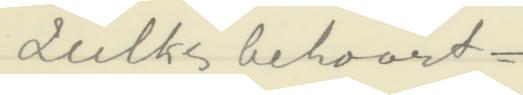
zulks behoort -
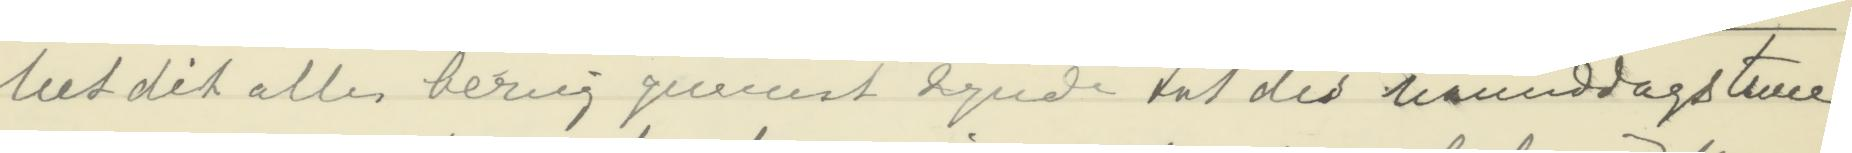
Met dit alles bezig geweest zijnde tot des namiddags twee
